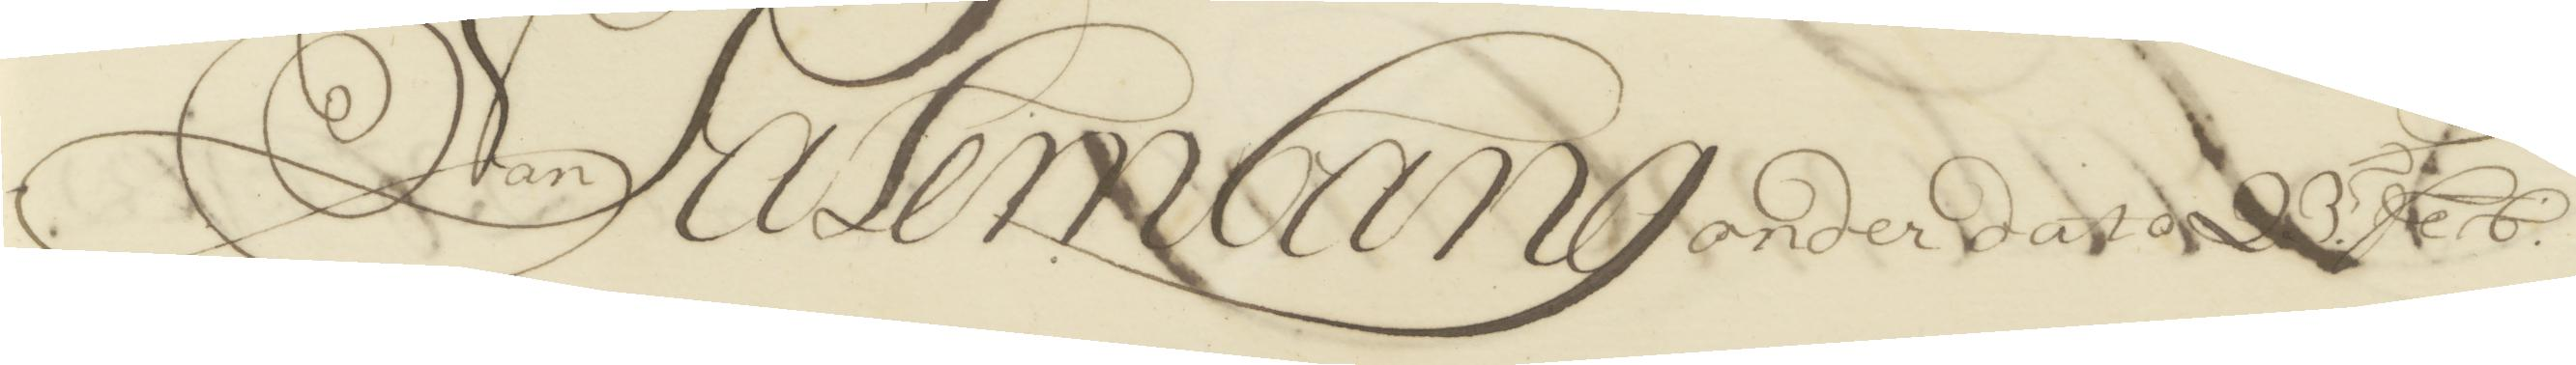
Van Palembang onder dato 23:' feb:
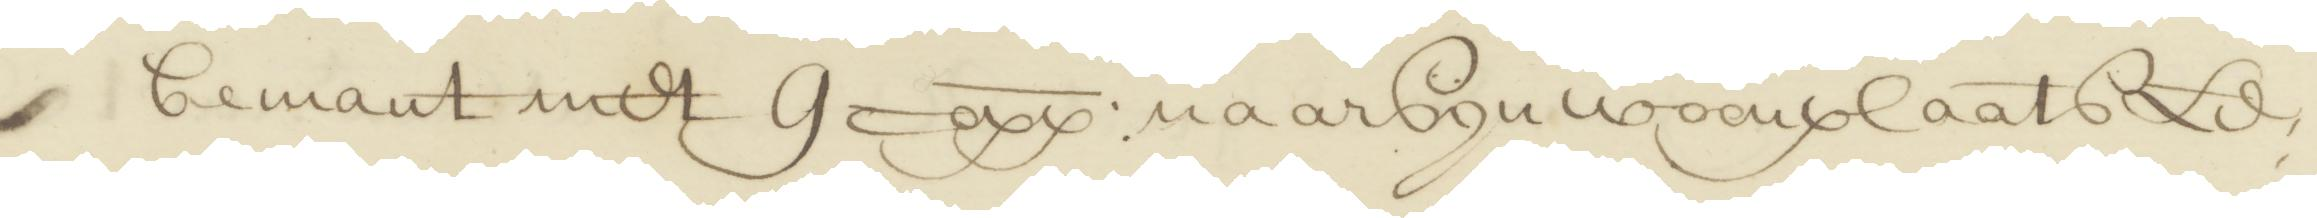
bemant met 9 copp: naar sijn woonplaats te„
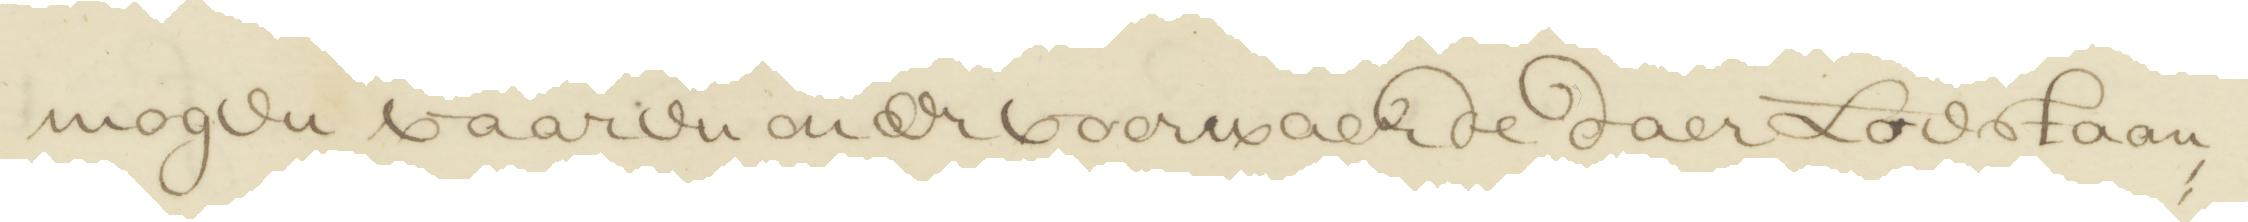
mogen vaaren onder voorwaerde daer toestaan„
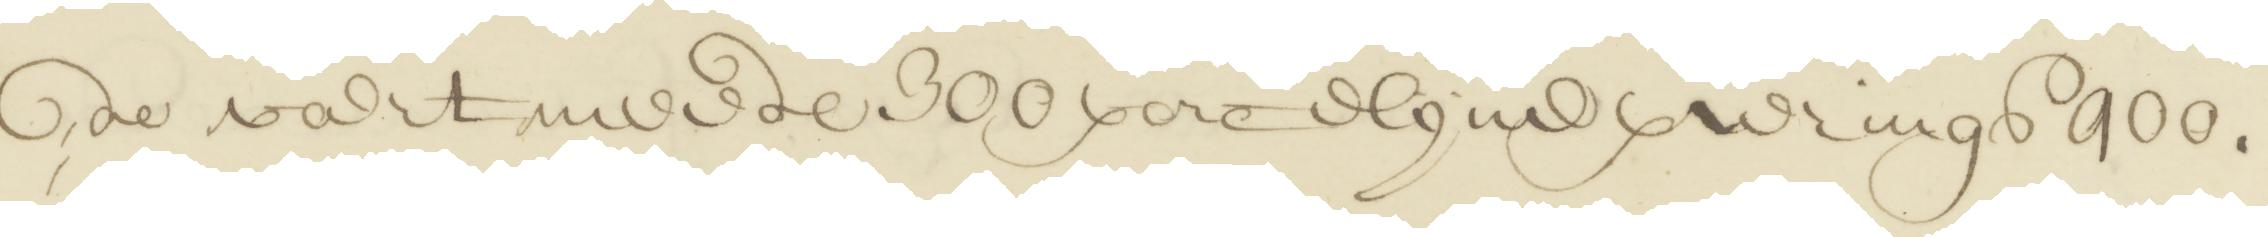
de voert meede 300 porcelijne pierings 400.
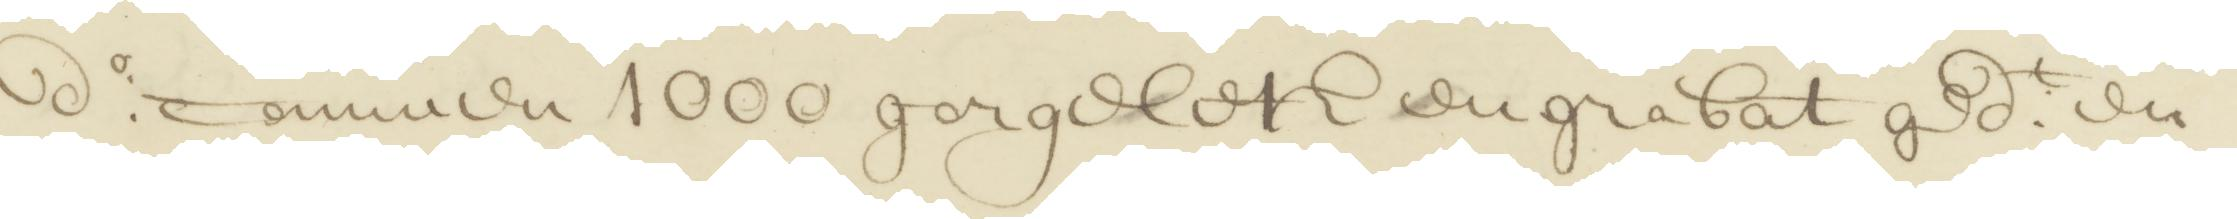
d:o commen 1000 gorgeleth en grabat ged:t en
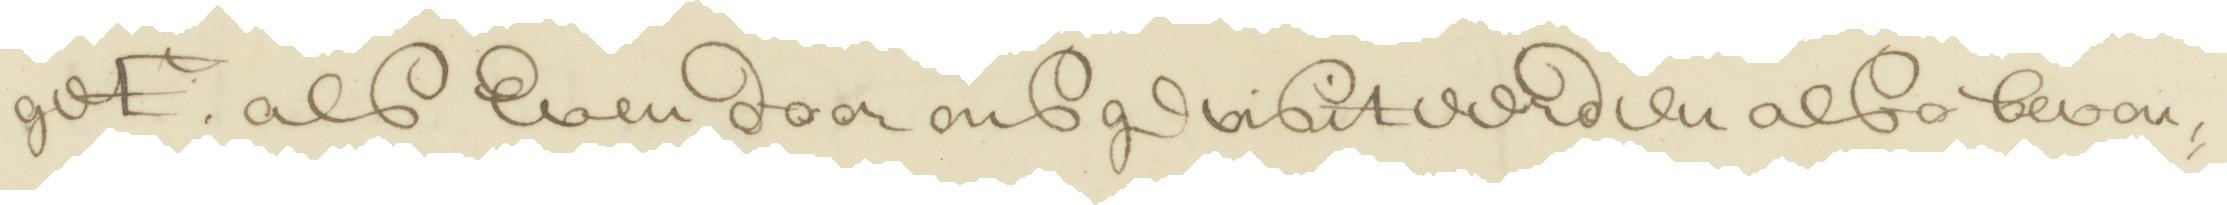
get:t als Even door ons gevisiteerden also bevon„
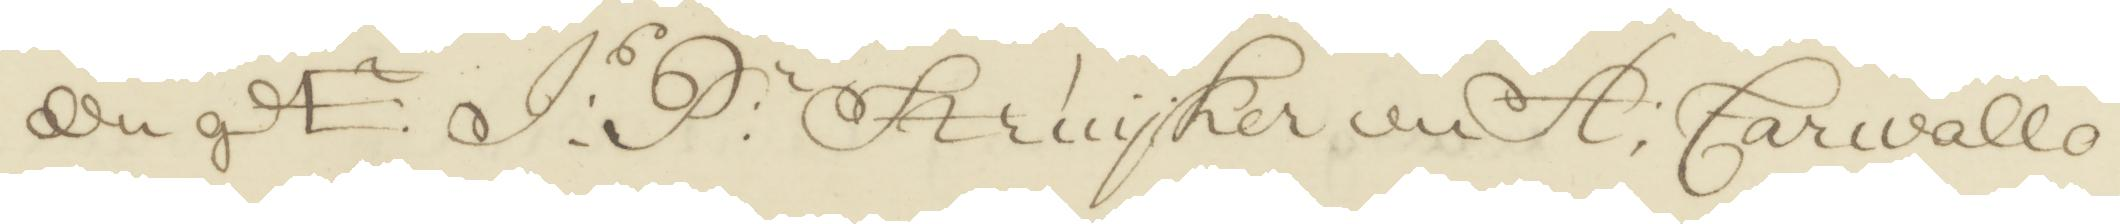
den get:t I:s P:r struijker en A: Carwallo
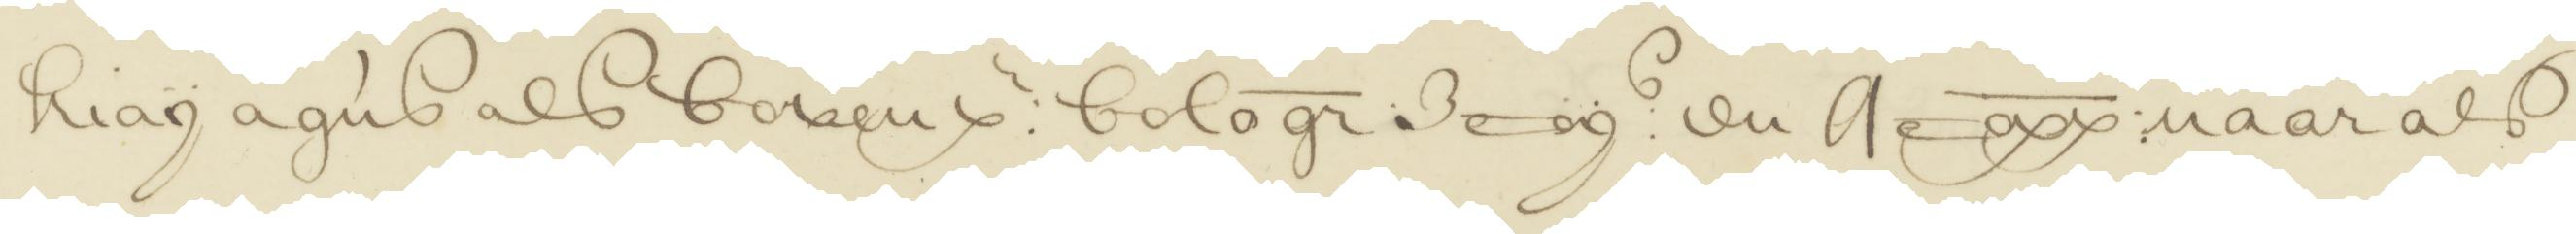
kiaij agus als boven p:r bologr 3 coij:s en 4 copp: naar als
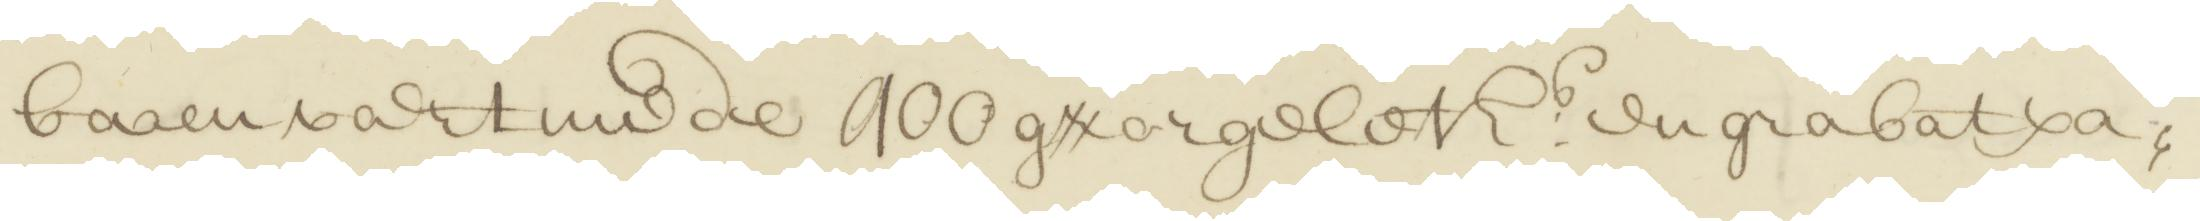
boven voert mede 400 grorgeleth:s en grabatpa„
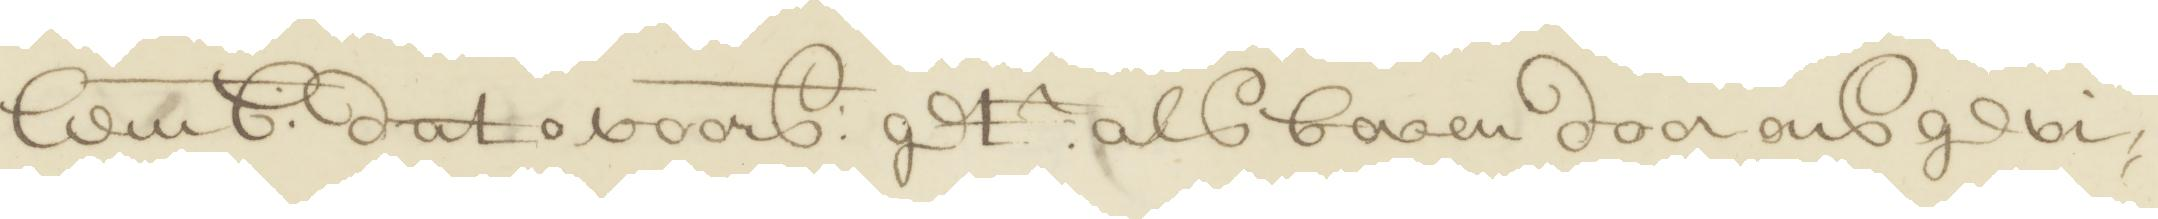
temb: dato voors: get:t als boven door ons gevi„
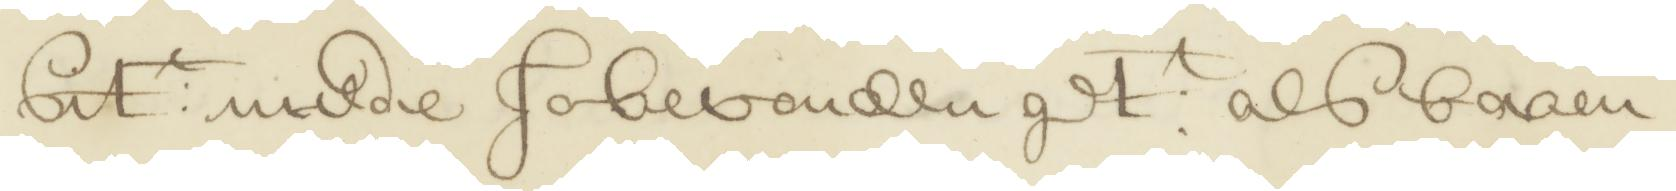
sit:t mede so bevonden get:t als boven
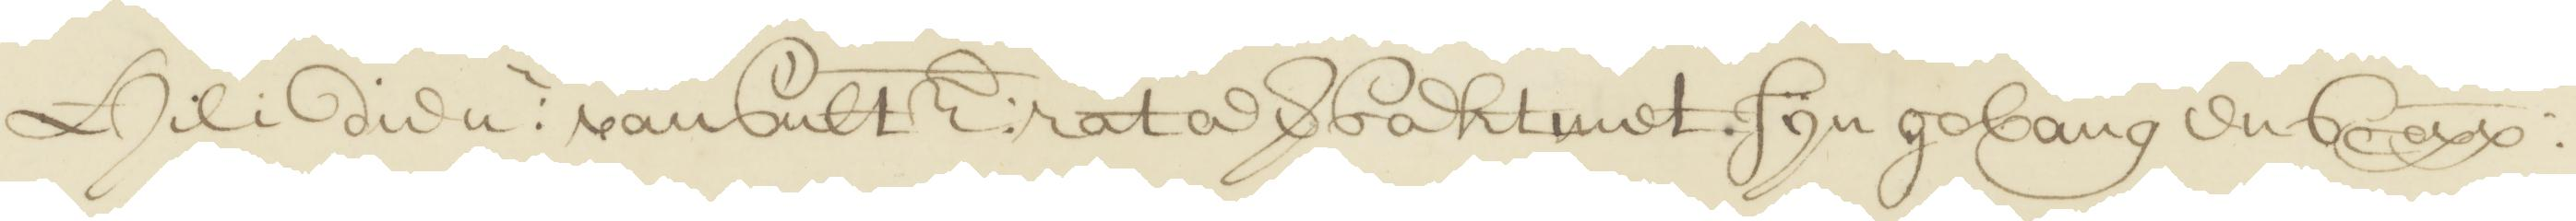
TJili dien:r van sulth: ratoe verboekt met sijn gobang en Copp:
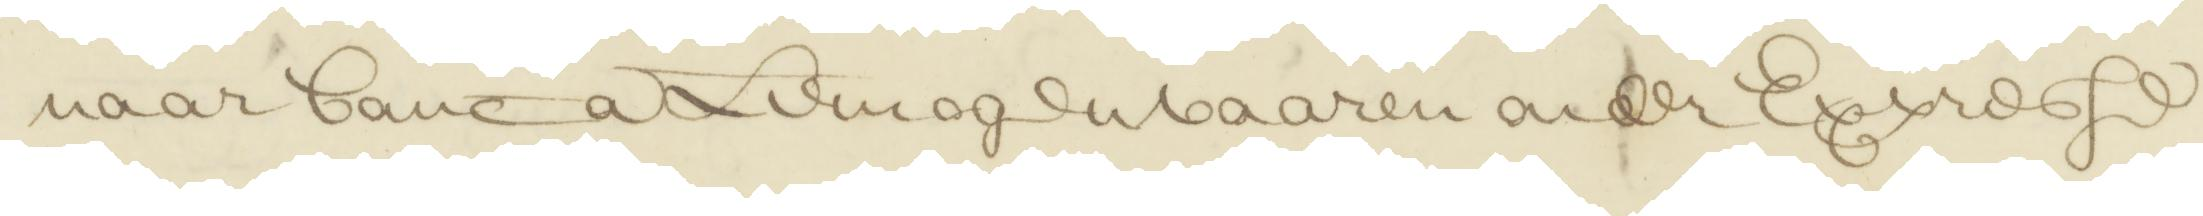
naar banca temogen vaaren onder Expresse
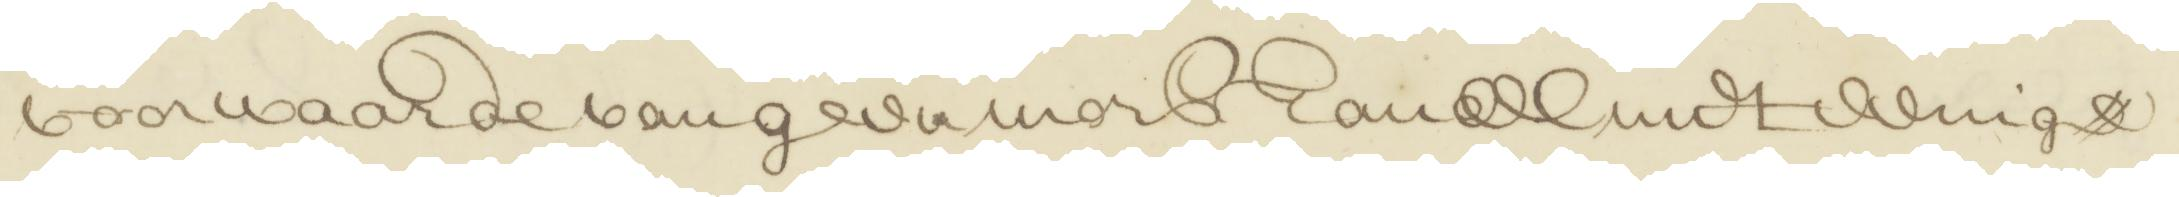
voorwaarde van geen mors handel met eenige
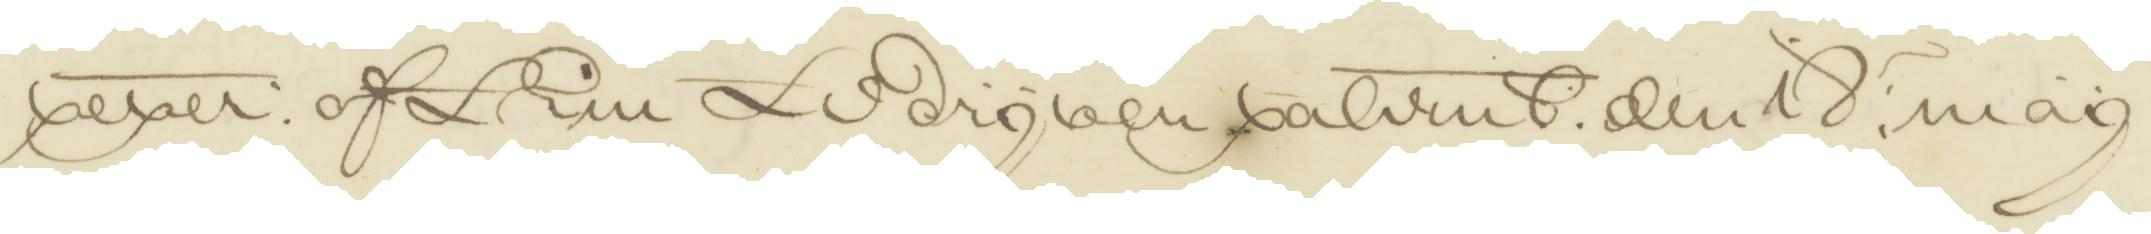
peper: of thin te drijven palemb: den 18: maij
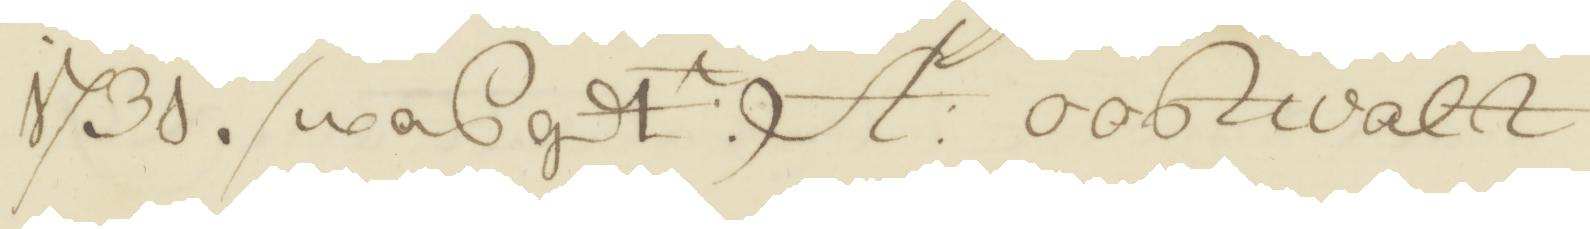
1738. /was get:t: A: oostwalst
